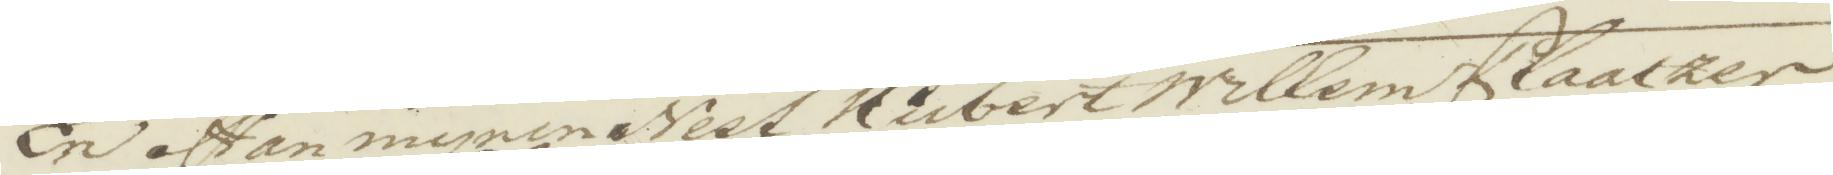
En Aan mynen Neef Hubert Willem Plaatzer
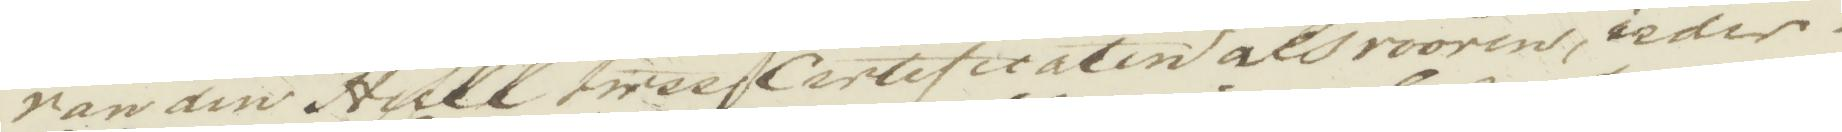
van den Hull twee Certificaten als vooren, ieder
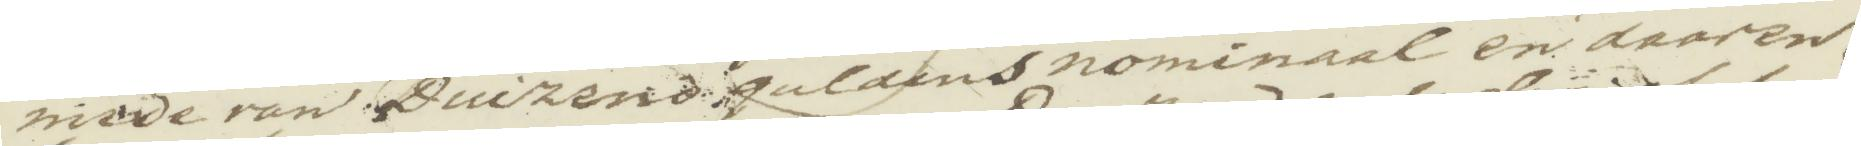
mede van Duizend guldens nominaal en daaren,
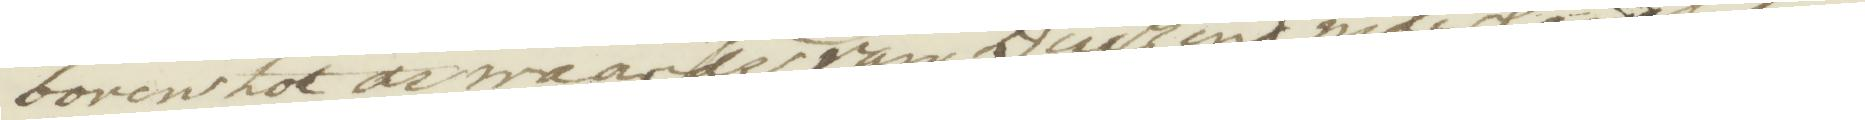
boven tot de waarde van Duizend nederlandsche
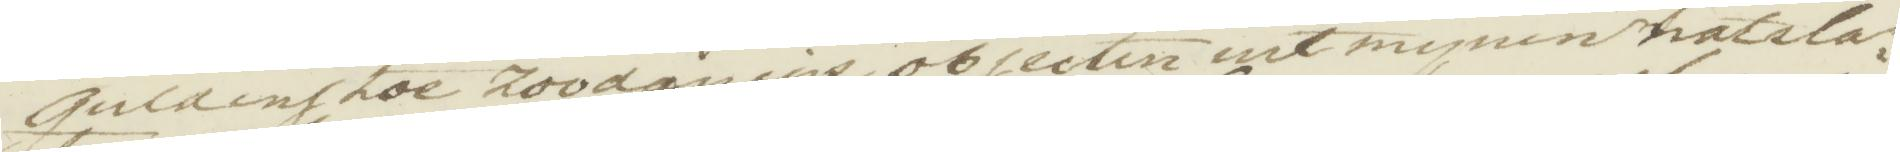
Guldens hoe zoodanige objecten uit mynen natela„
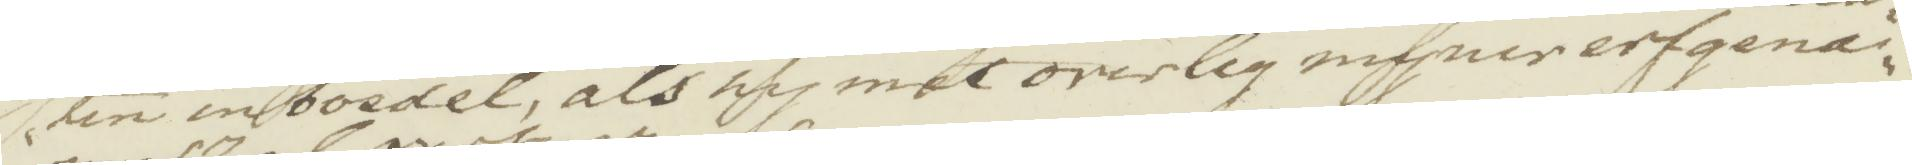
„ten inboedel, als hy met overleg myner erfgena„
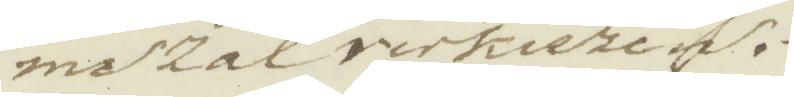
me zal verkiezen.
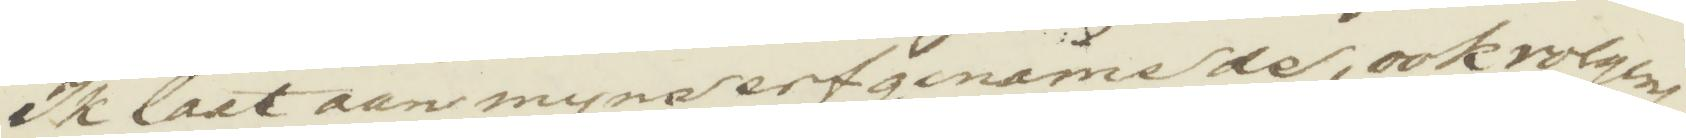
Ik laat aan myne erfgename de, ook volgens
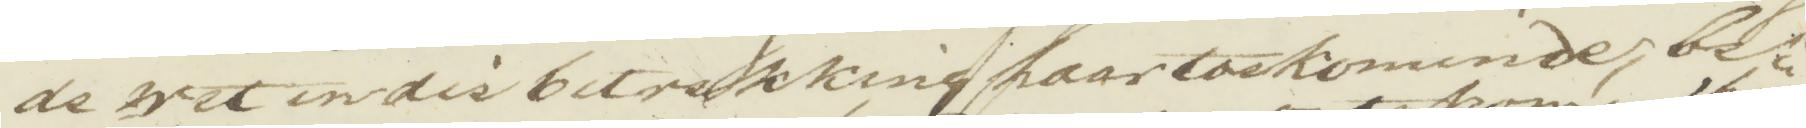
de wet in die betrekking haar toekomende, be
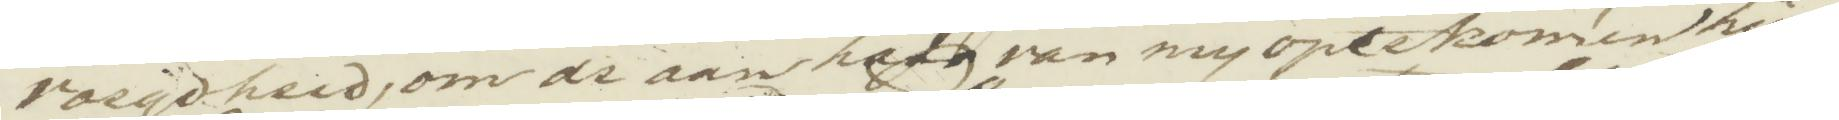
voegdheid, om de aan haar van my op te komen hui
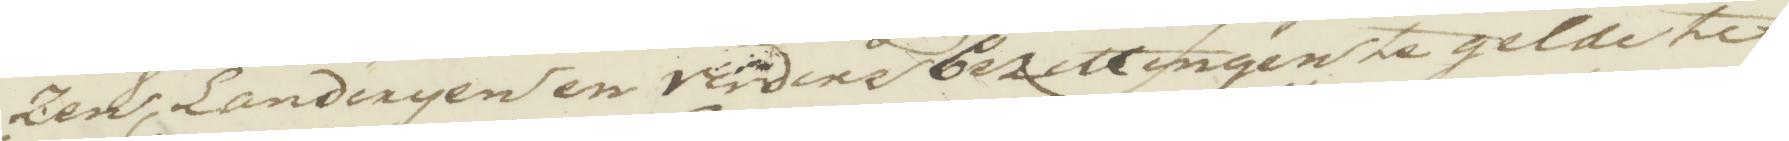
zen, Landeryen en verdere bezittingen te gelde te
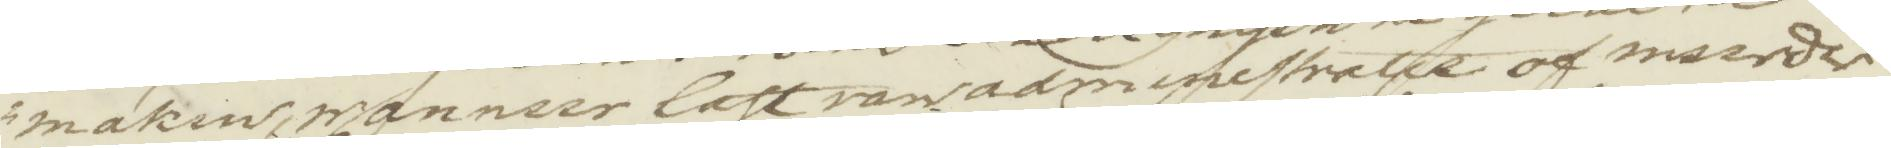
maken, wanneer last van administratie of meerder
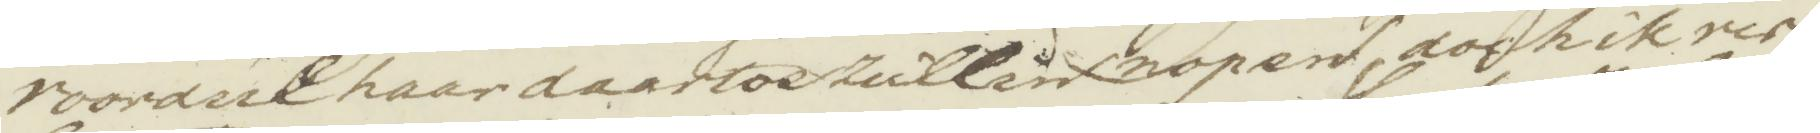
voordeel haar daartoe zullen nopen, doch ik ver
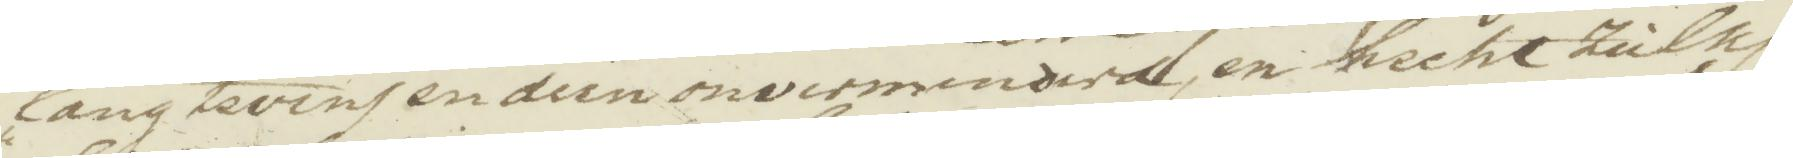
lang tevens en dien onverminderde, en recht zulks
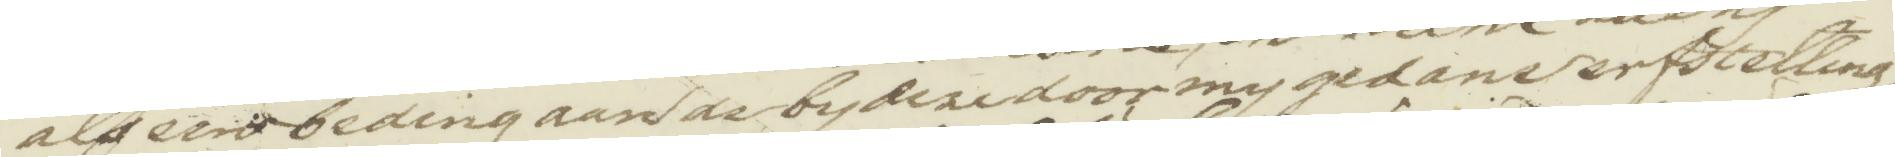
als een beding aan de by deze door my gedane erfstelling,
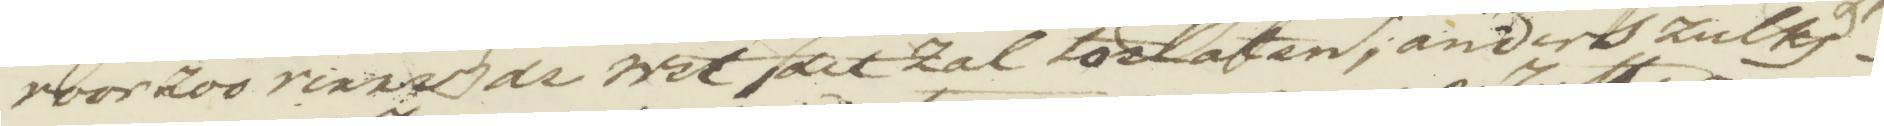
voor zoo verre de wet dit zal toelaten; anders zulks
